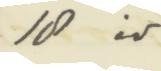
18 id
